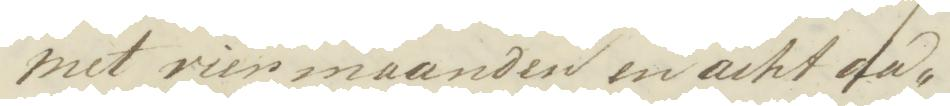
met vier maanden en acht da„
